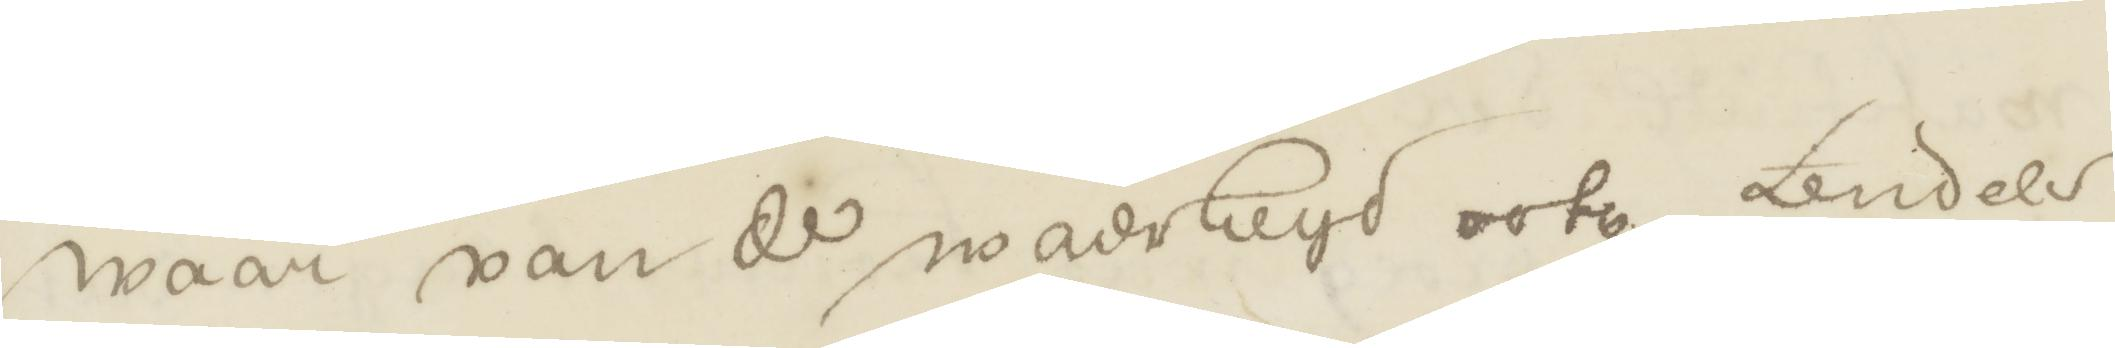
waar van de waerheyd ook ten dele
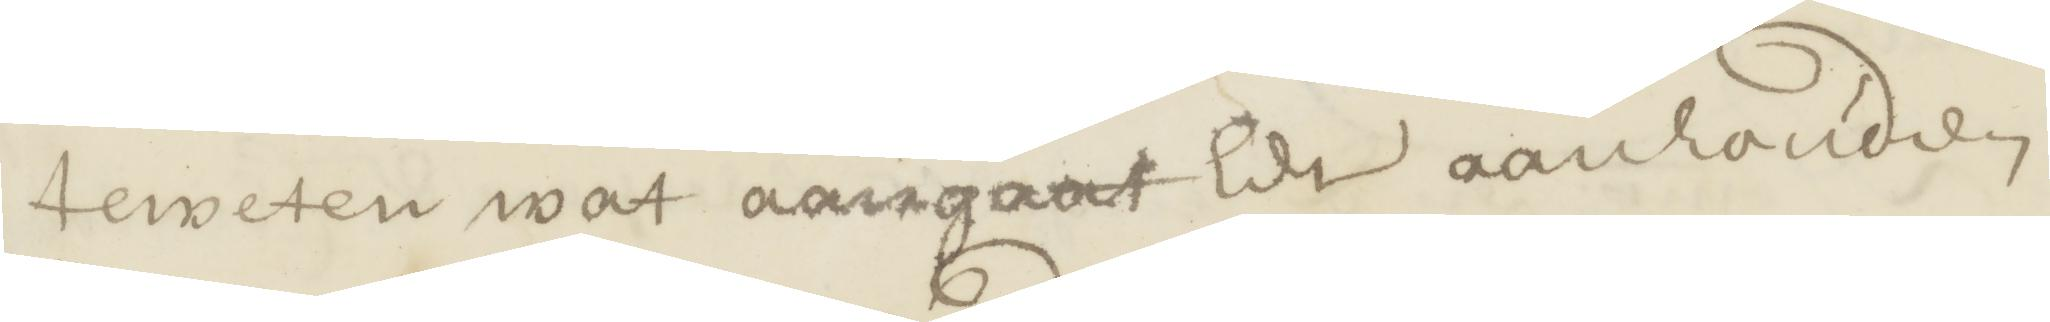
teweten wat aangaat het aanhouden
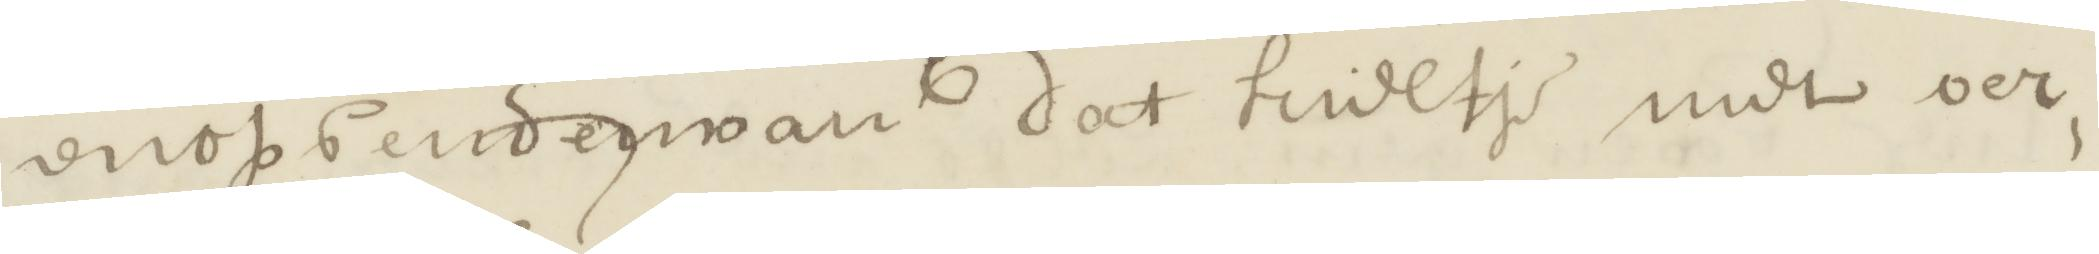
en op senden van dat kieltje met ver„
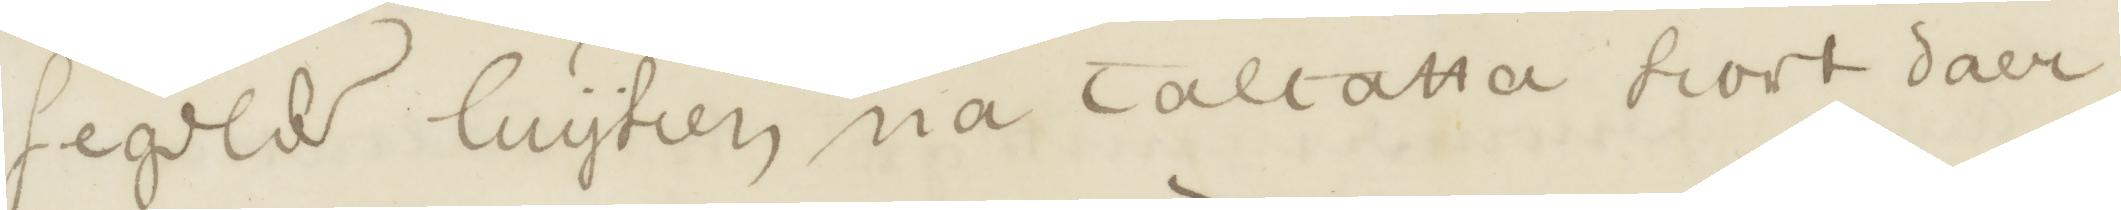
segelde luijken na Calcatta kort daer
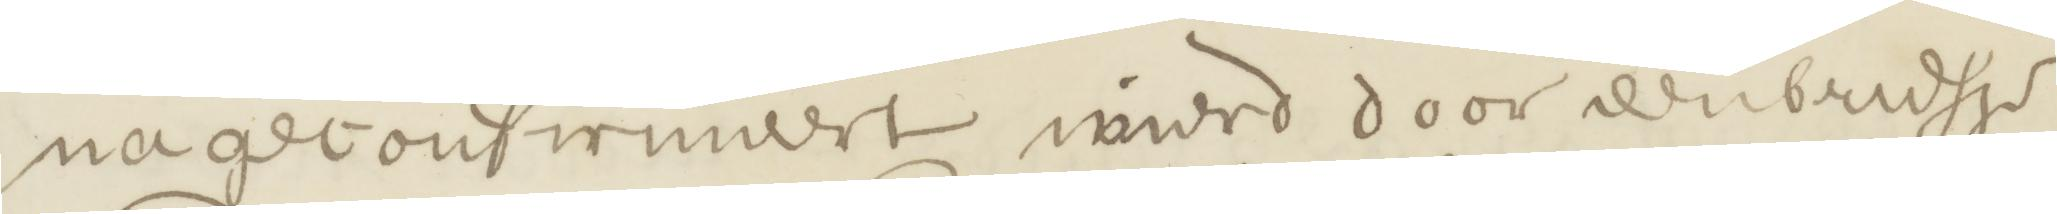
na geconfirmeert wierd door een briefje
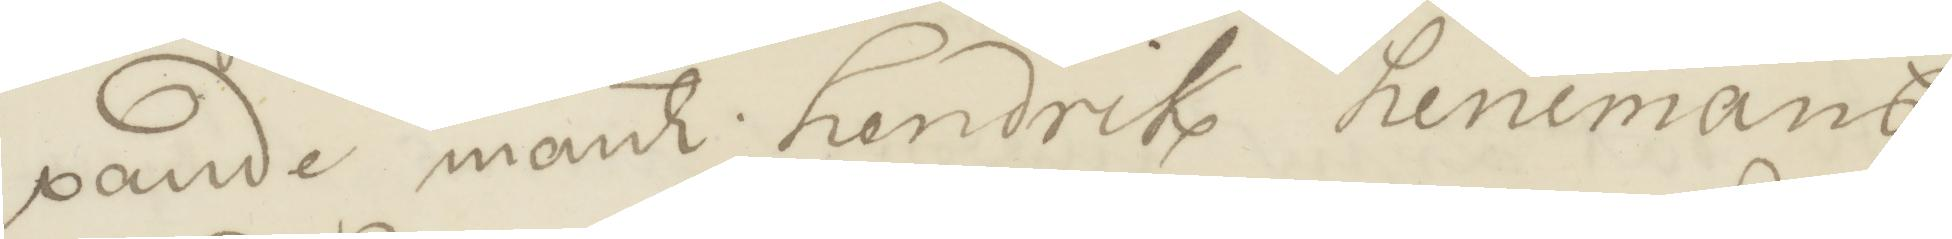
vande manh: hendrik henemans
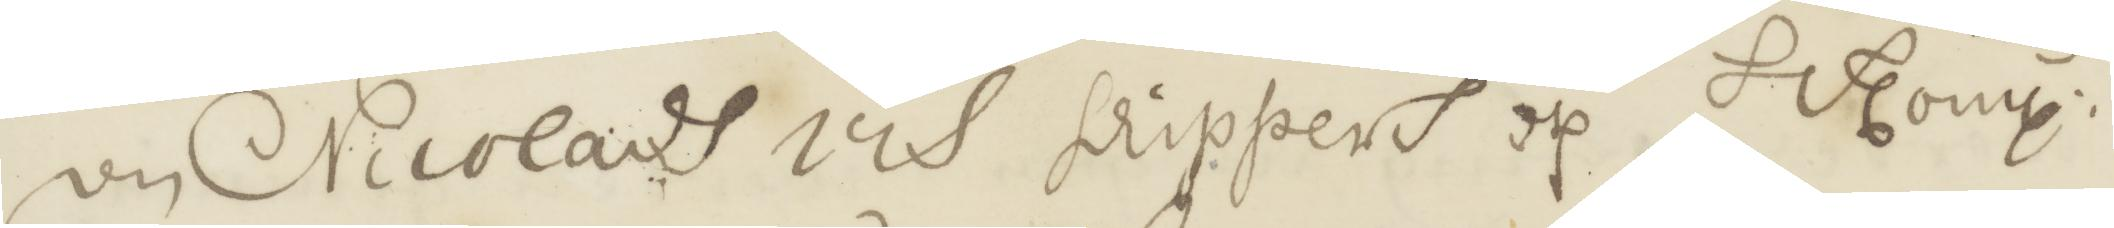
en Nicolaes vis schippers op SEcomp:s
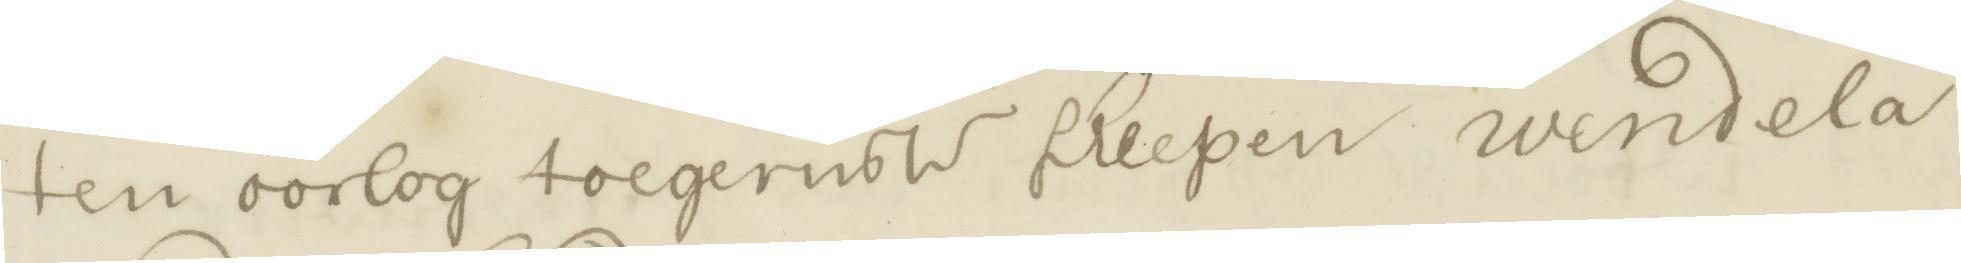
ten oorlog toegeruste scheepen wendela
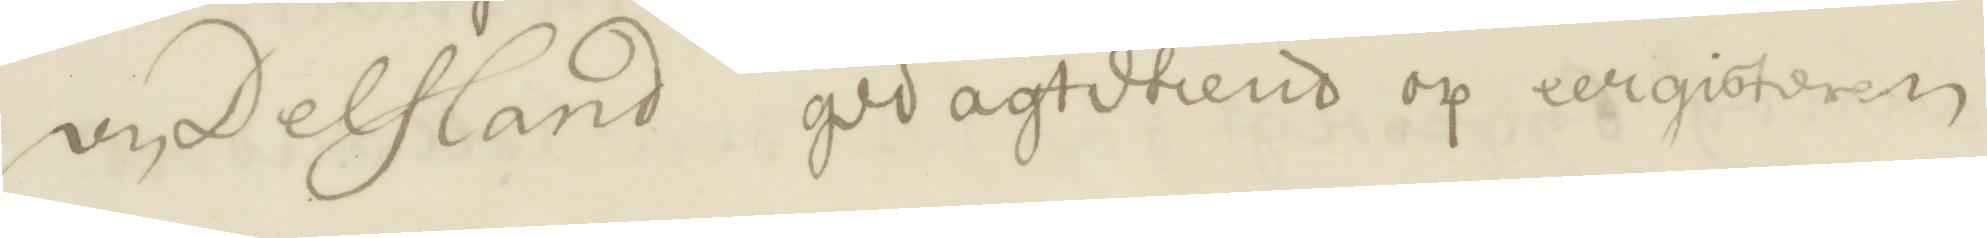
en Delfland gedagtekend op eergisteren
